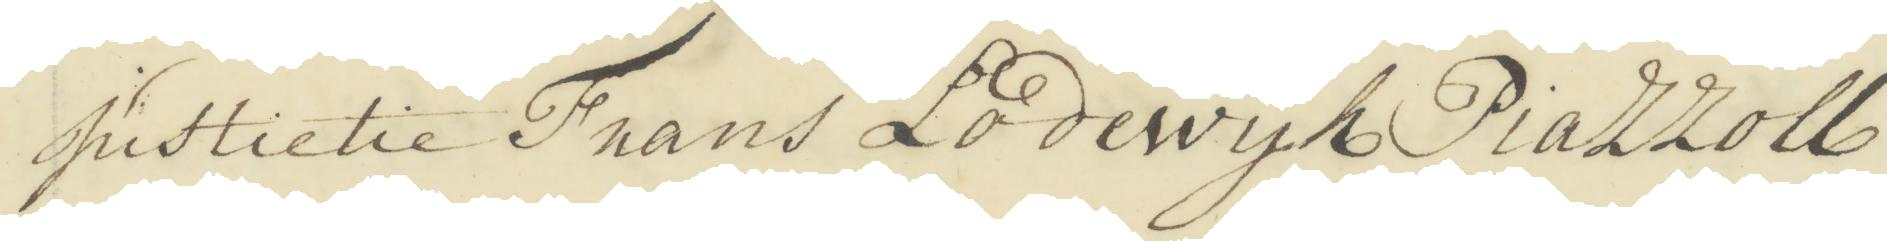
justietie Frans Lodewijk Piazzoll
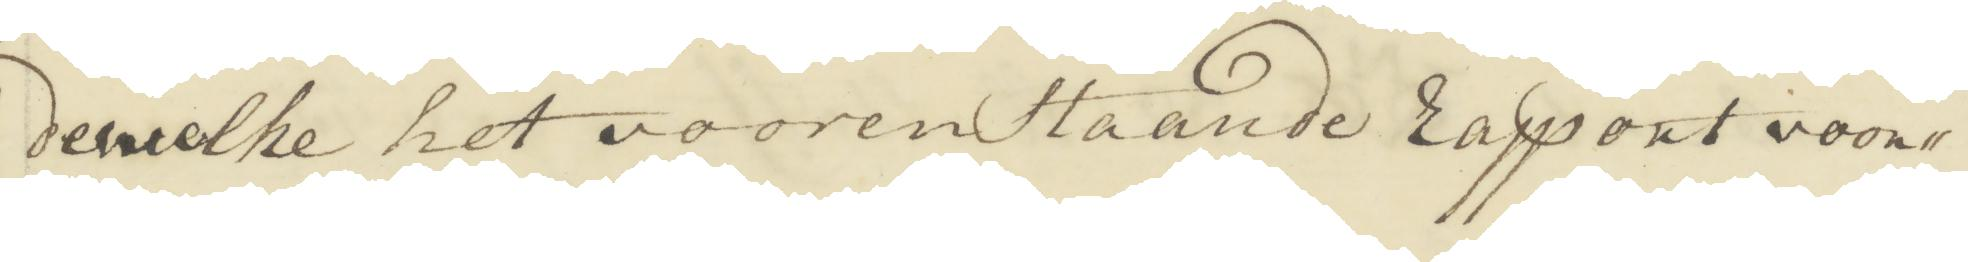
dewelke het voorenstaande rapport voor„
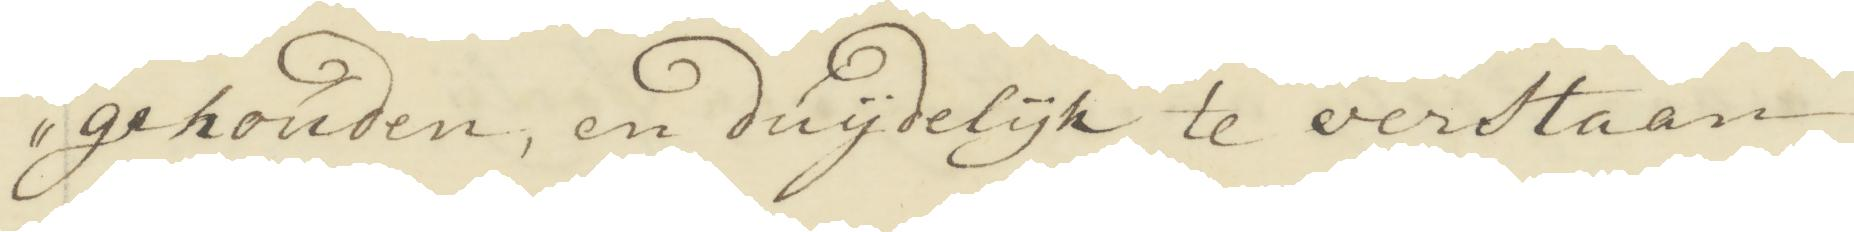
„gehouden, en duijdelijk te verstaan
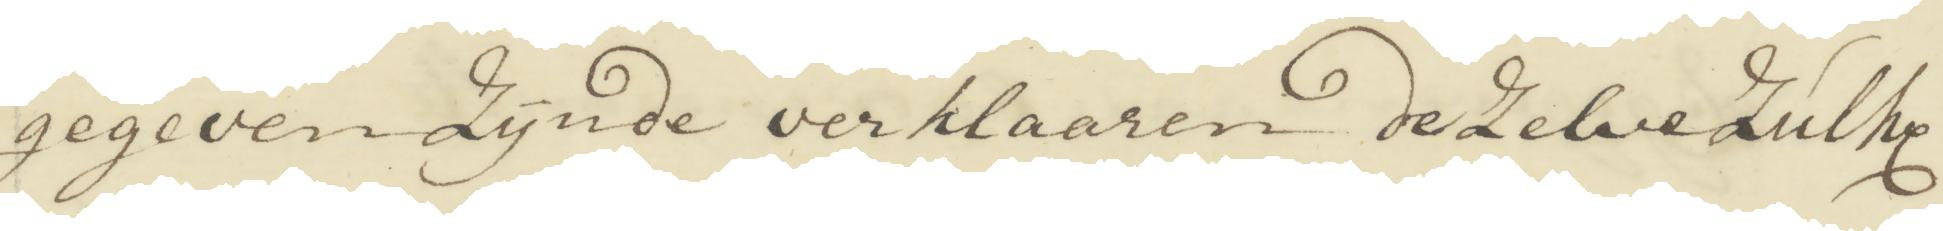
gegeven zijnde verklaaren dezelve zulkx
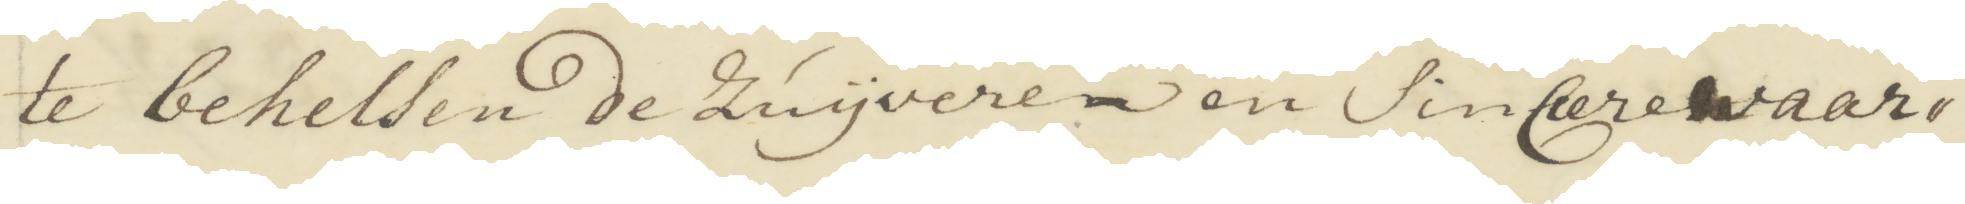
te behelsen de zuijveren en sincere waar„
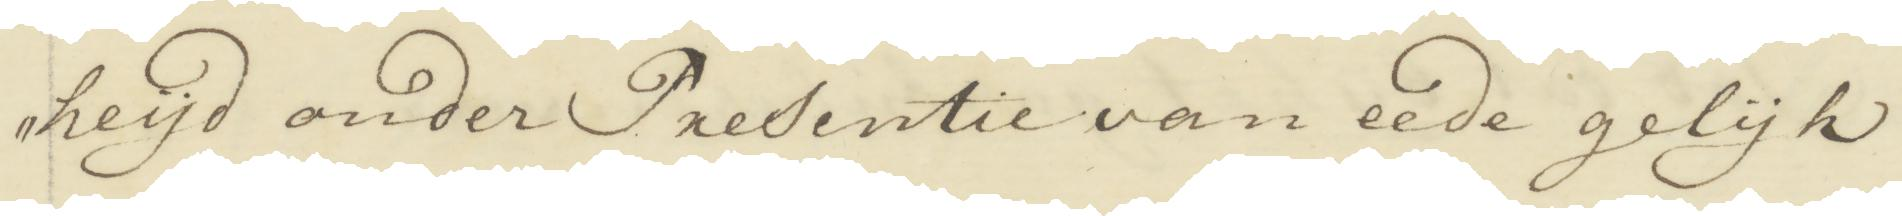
„heijd onder Presentie van eede gelijk
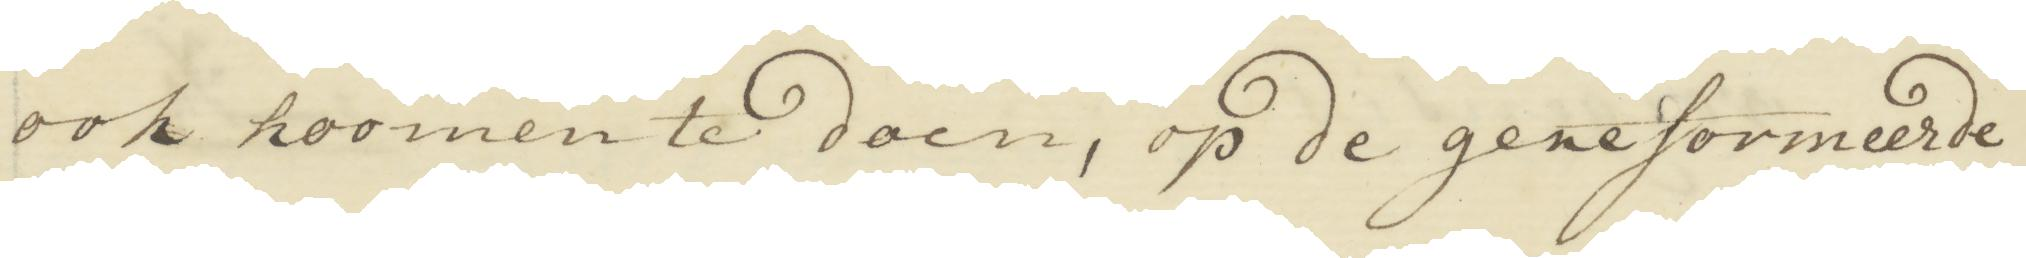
ook koomen te doen, op de gereformeerde
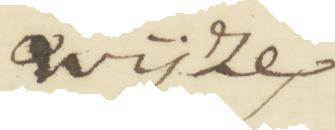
wijze
